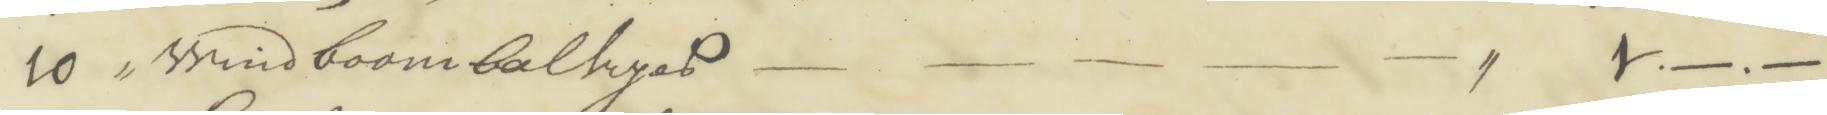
10 „ Wind boom balkjes — — — — —„ 1. —. —
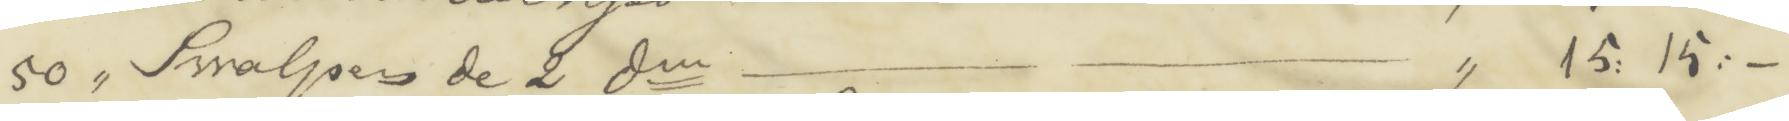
50 „ Swalpen de 2 d=m — — — — „ 15: 15: —
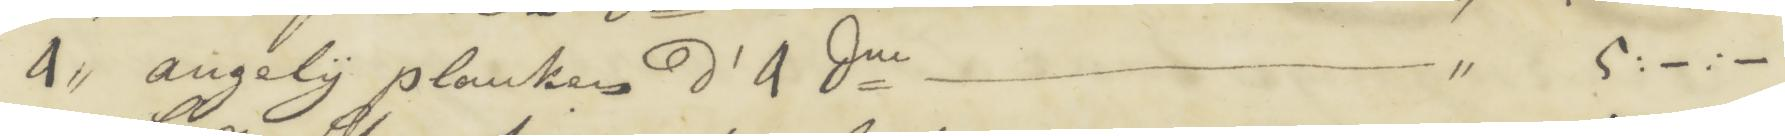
4 „ angelij planken d’ 4 d=m —————— „ 5: —: —
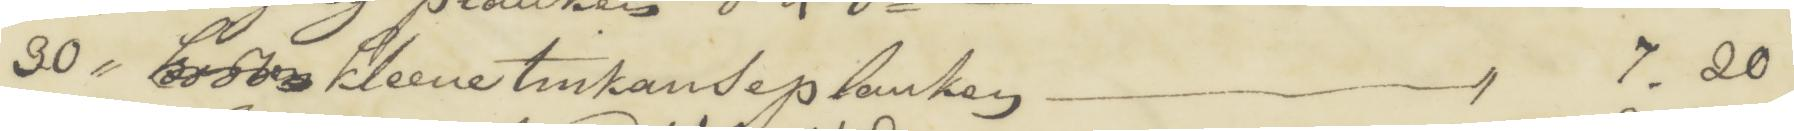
30 „hoose kleene tinkanse planken ————„ 7. 20
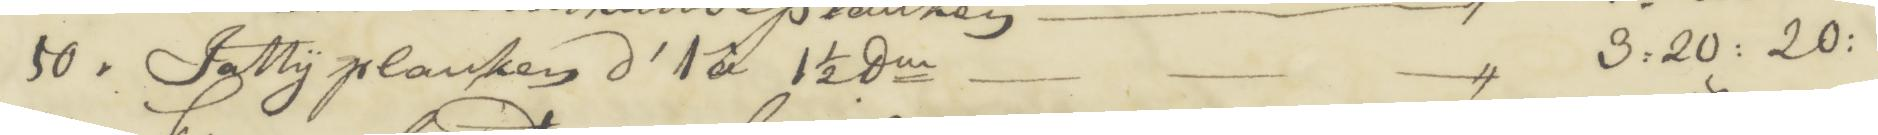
50 „ Iattij planken d’ 1 â 1½ d=m — — — — „ 3: 20: 20:
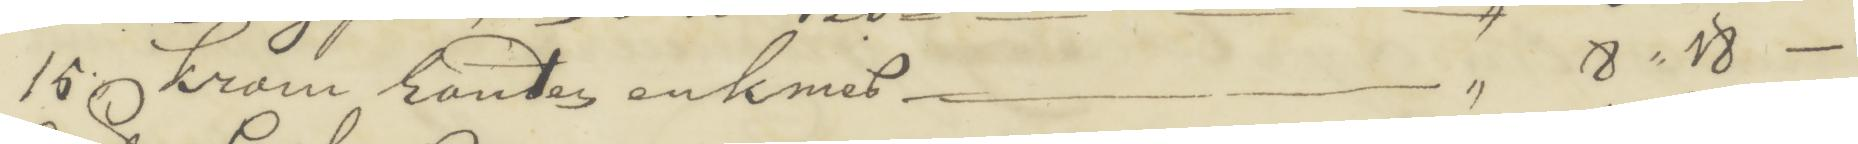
15 „ krom houten en knies ———— „ 8 „ 18 —
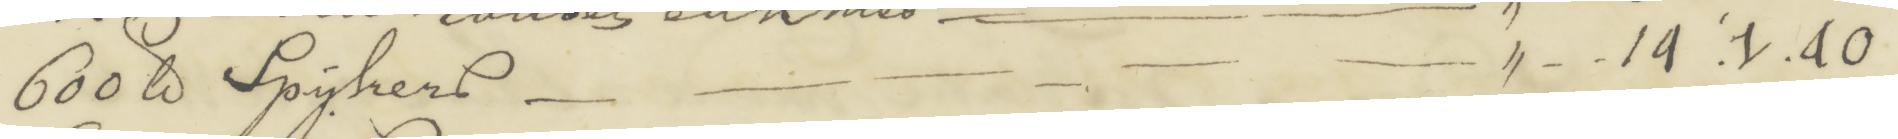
600 lb Spijkers — ——— — — „ 14. 1. 40
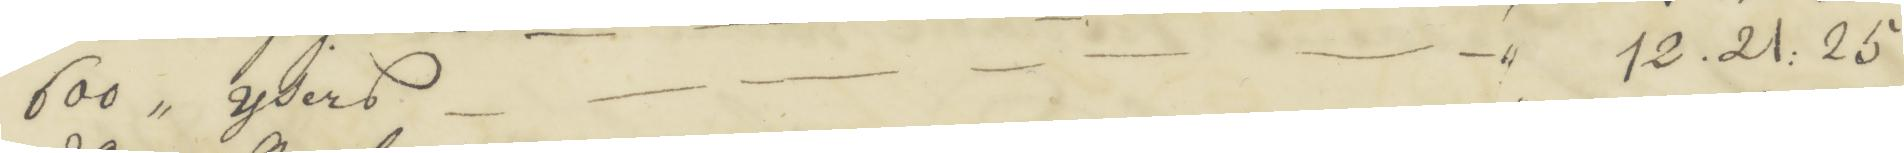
600 „ ysers — — — — — —„ 12. 21: 25
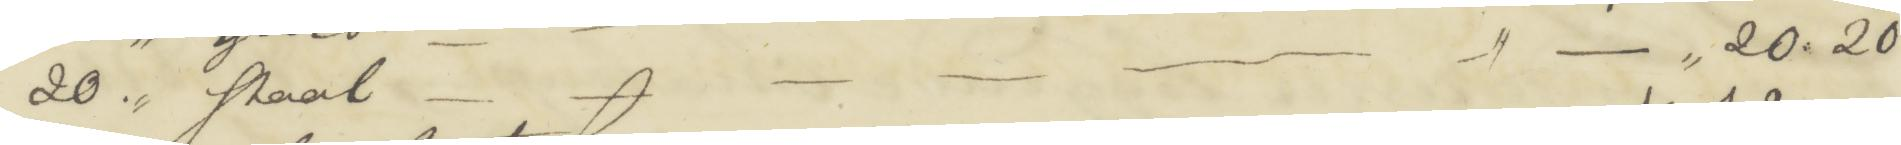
20 „ staal — — —— —— ————„ — „ 20. 20
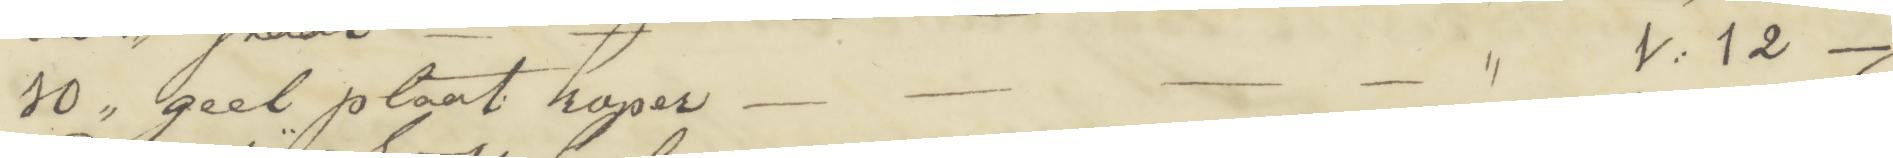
10 „ geel plaat koper — — —— —— „ 1: 12 —
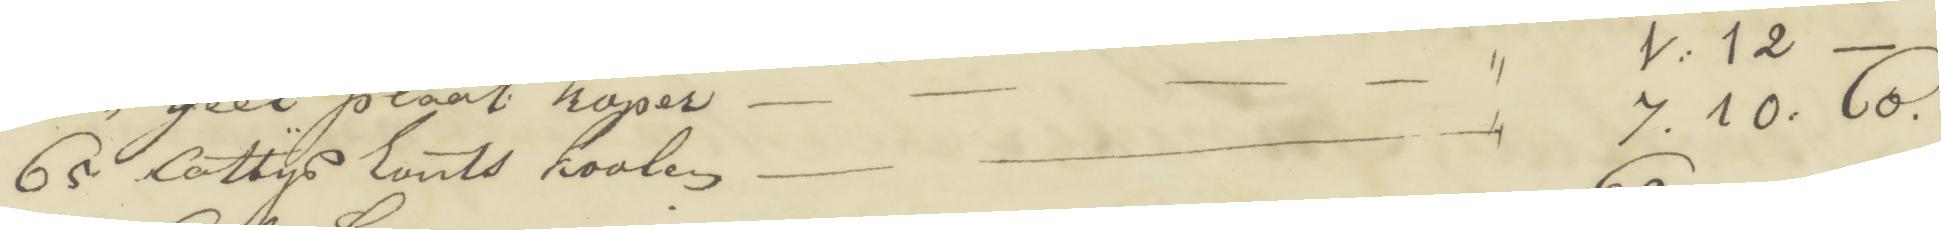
65 Cattijs houts koolen —— —— —— „ 7. 10. 60.
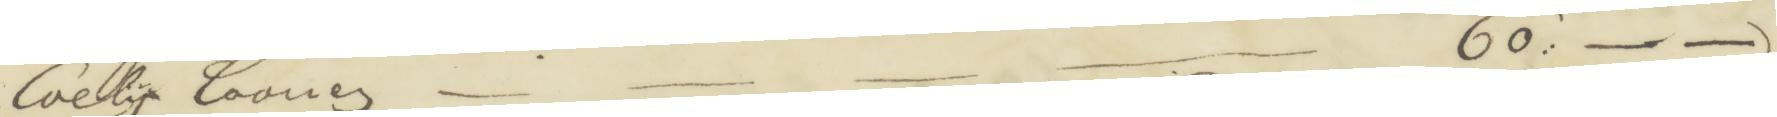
Coelij loonen — — — —— 60: — —
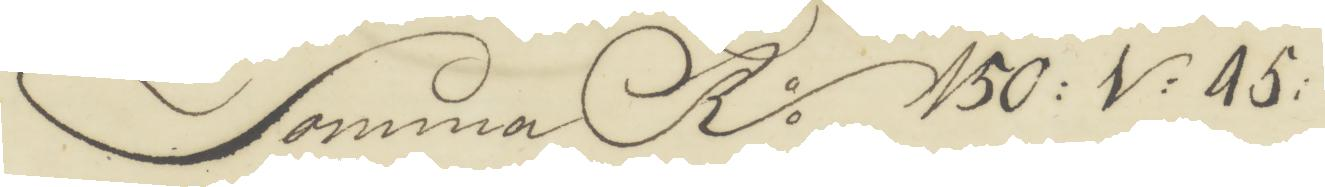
Somma R:a/o 150: 1: 45:
